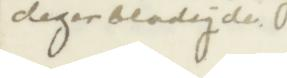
dezer bladzijde.
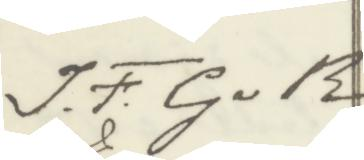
I.F. Gv R
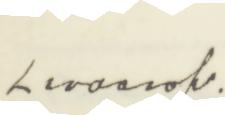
¶ waarop.
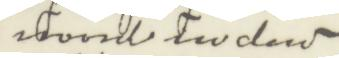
woord in den
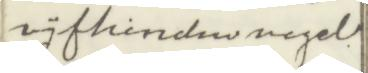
vijftienden regel.
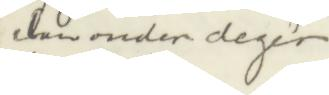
van onder dezer
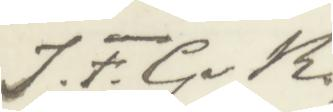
J.F.Gv R
